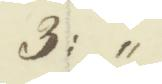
3: „
